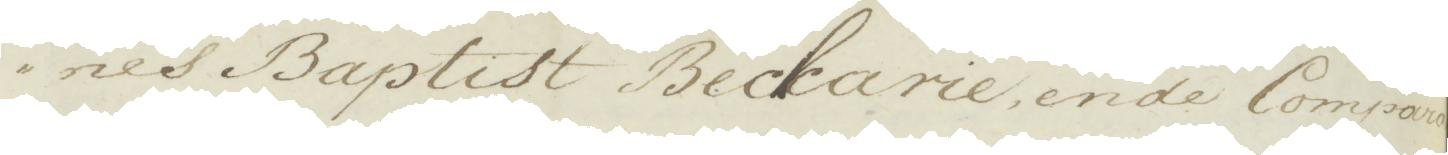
„nes Baptist Beckarie, en de Compara
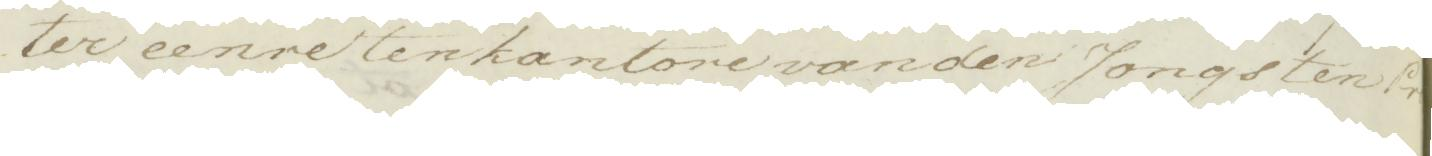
ter eenre ten kantore van den Jongsten Pr
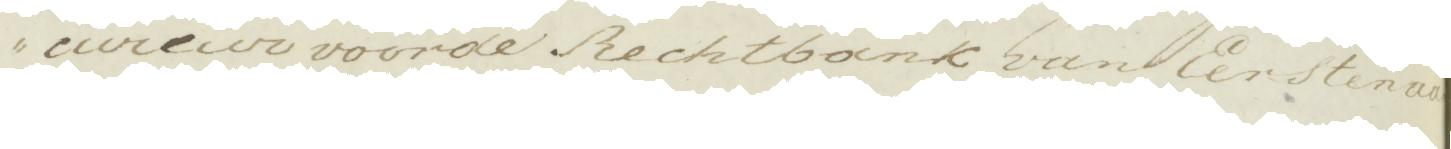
„cureur voorde Rechtbank van Eerstenaa
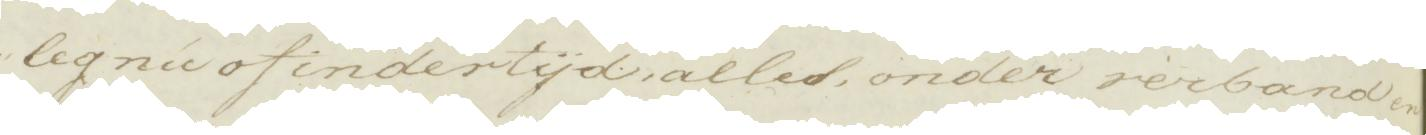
„leg nu of indertijd, alles, onder verband en
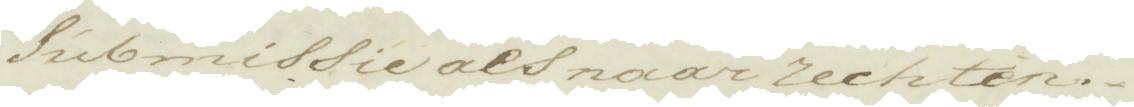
submissie als naar rechten.
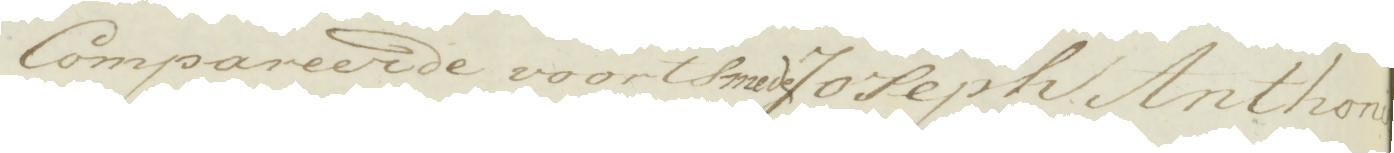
Compareerde voorts mede Joseph Anthon
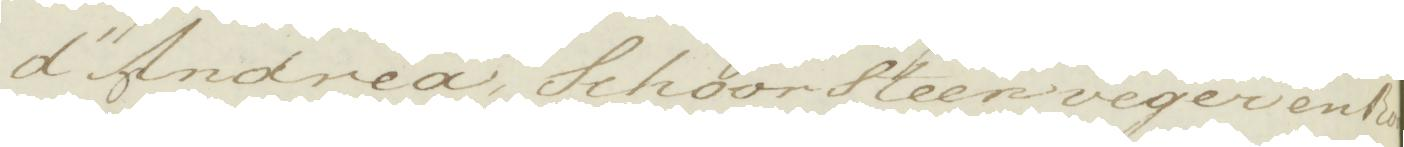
d’ Andréa, schoorsteenveger en Ko
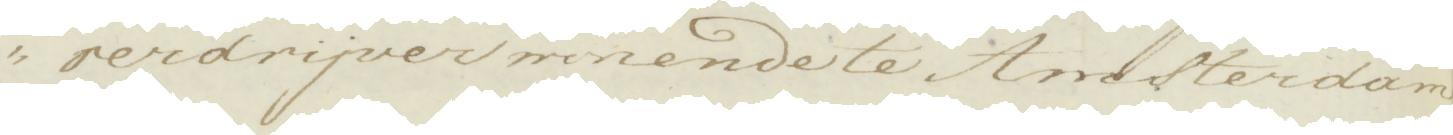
„perdrijver wonende te Amsterdam
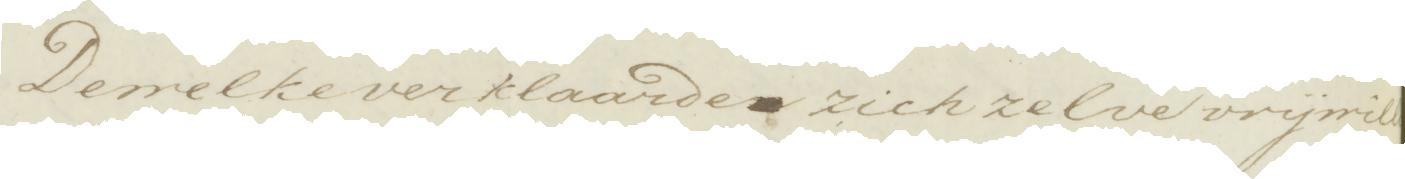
Dewelke verklaarde zich zelve vrijwill
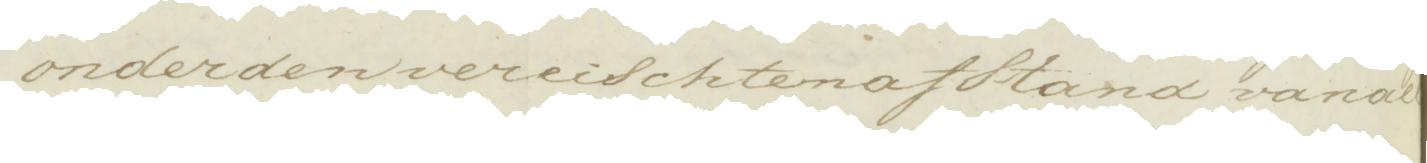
onder den vereischten afstand van all
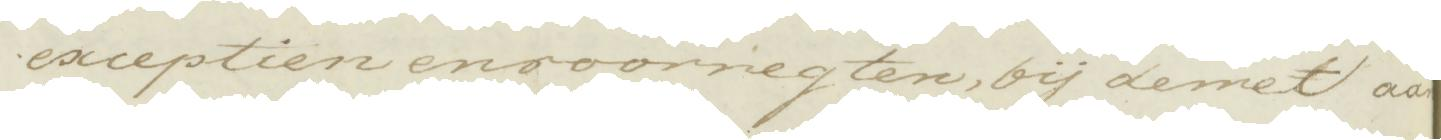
exceptien en voorregten, bij demet aa
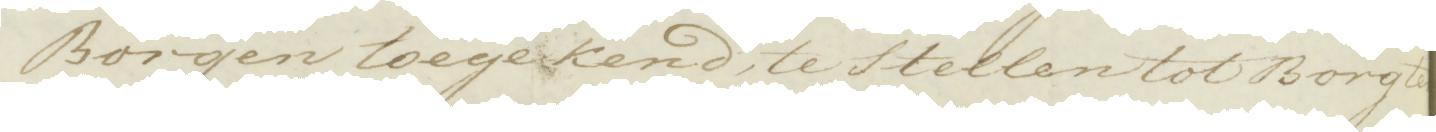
Borgen toegekend, te stellen tot Borg te
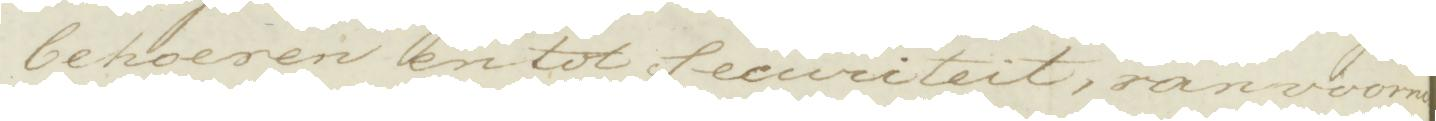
behoeven en tot securiteit, van voorn
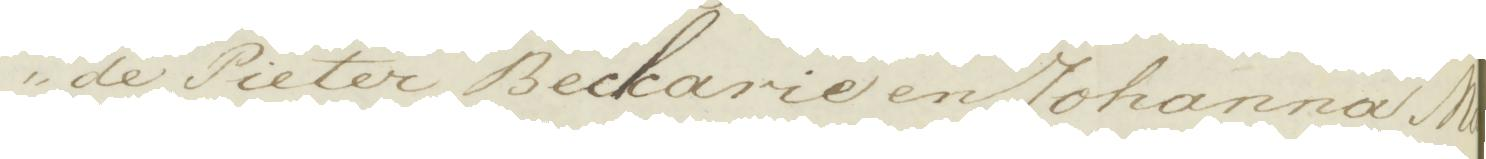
„de Pieter Beckarie en Johanna Ma
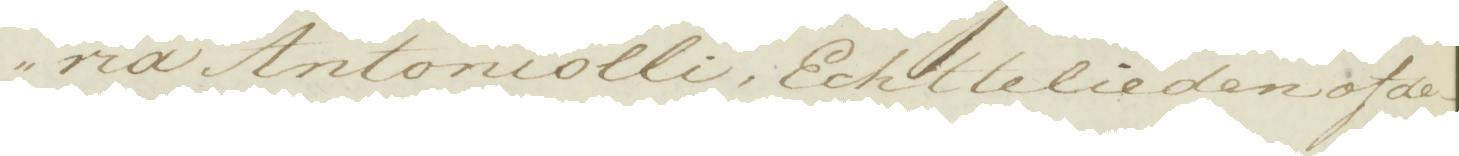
„ria Antoniolli, Echttelieden of de
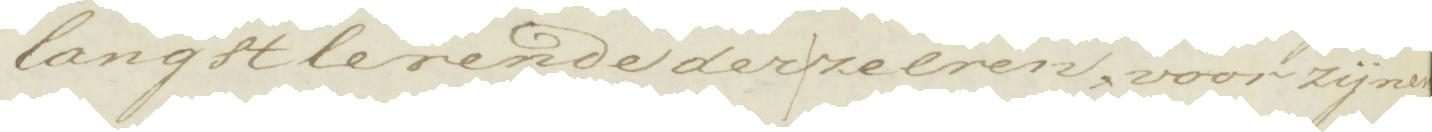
langst levende der zelven, voor zijnen
